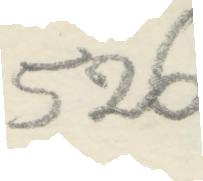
526
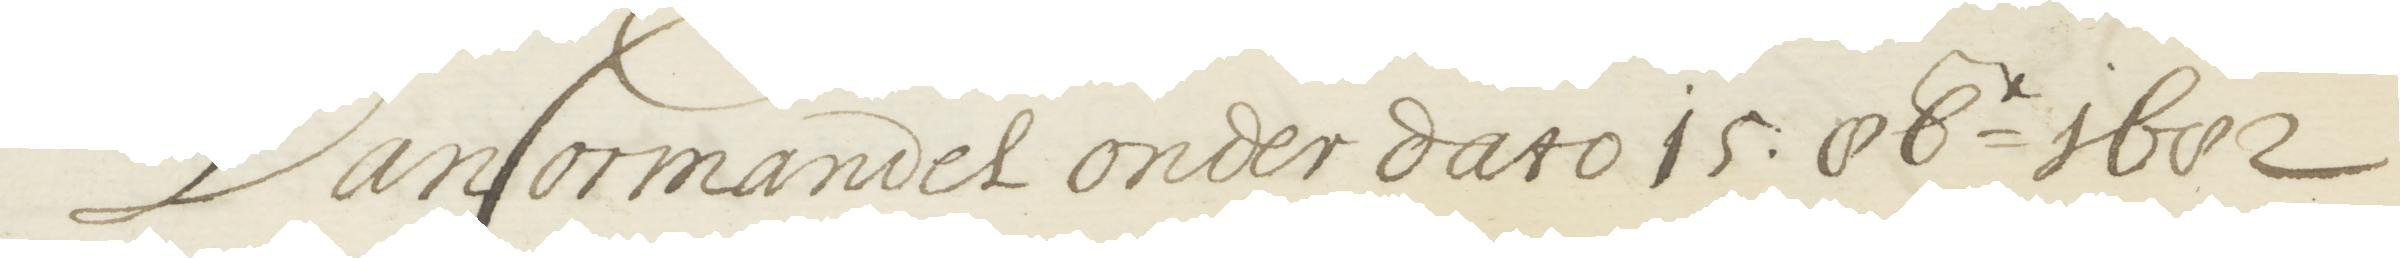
Van Cormandel onder dato 15: 8b=r 1682
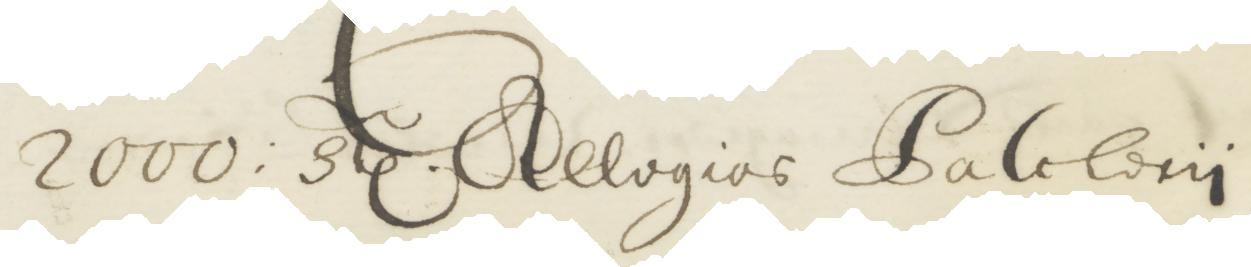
2000: stx. Allegias Patcherij
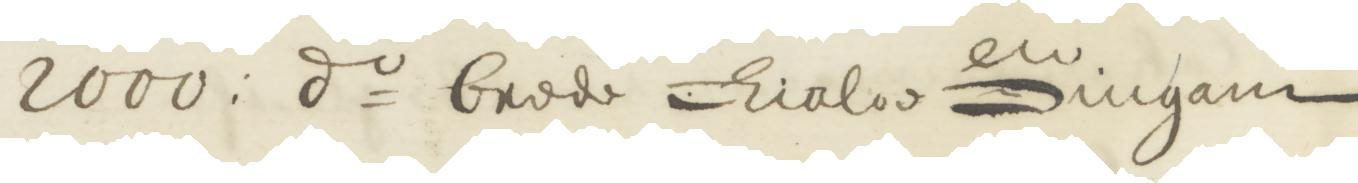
2000: d=o brede Chialoe Gingam
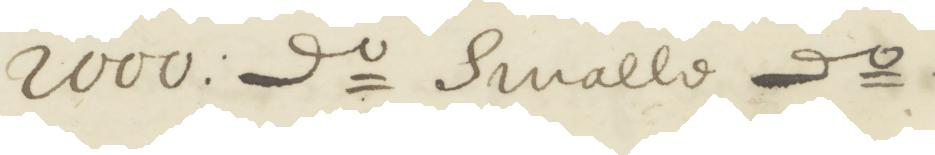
2000. D=o smalle D:o
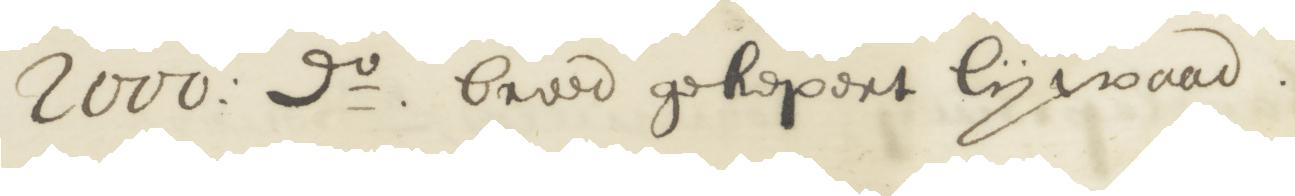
2000: D=o breed gekepert lijwaad.
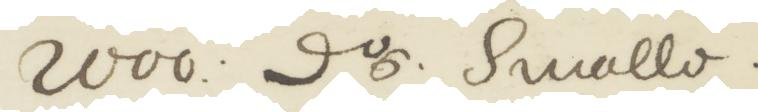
2000: D=o Smalle.
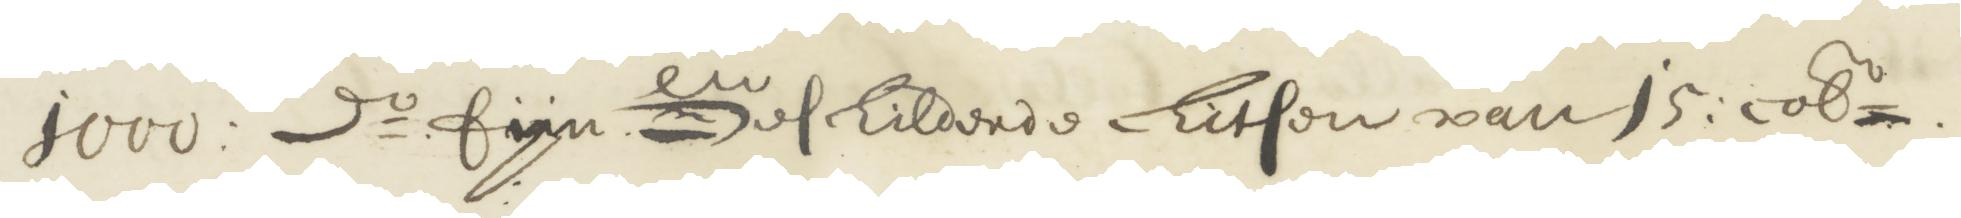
1000: D=o fijn Geschilderde chitsen van 15: cob=e
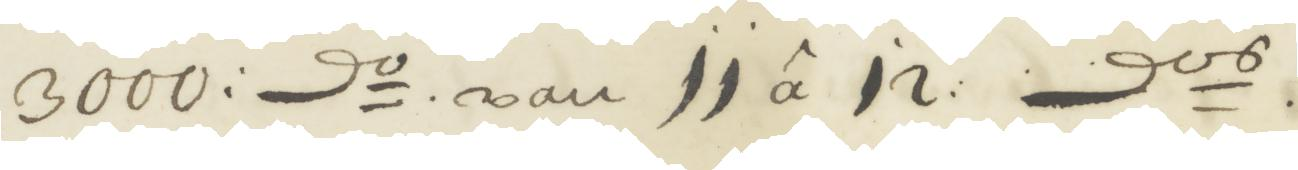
3000: D=o. van 11 â 12: D=os.
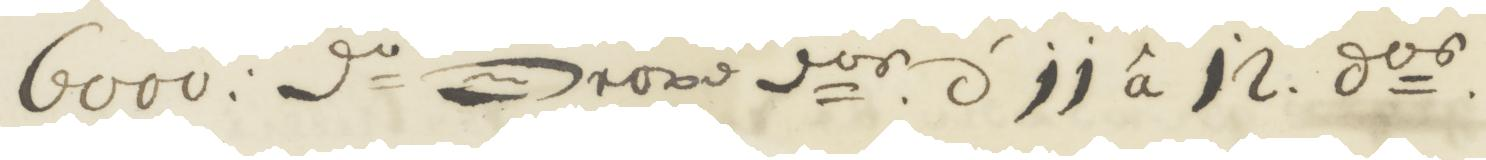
6000: D=o Grove D=os d' 11 â 12. d=os.
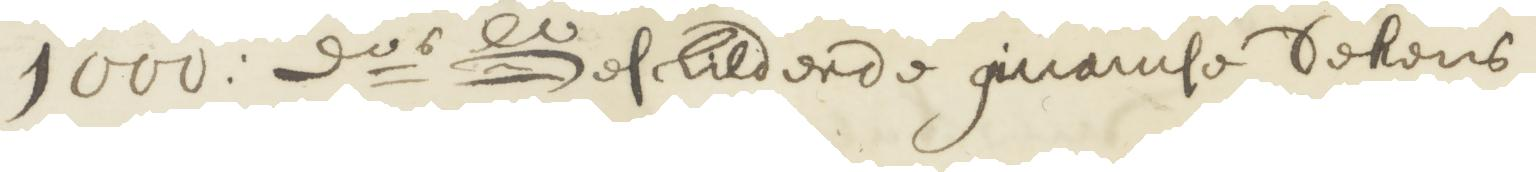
1000: D=os Geschilderde ginamse dekens
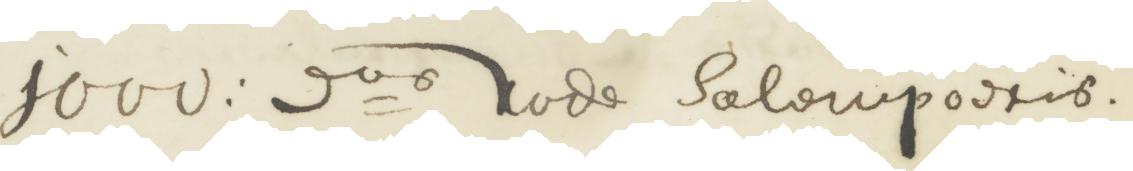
1000: D=os rode Salempoeris.
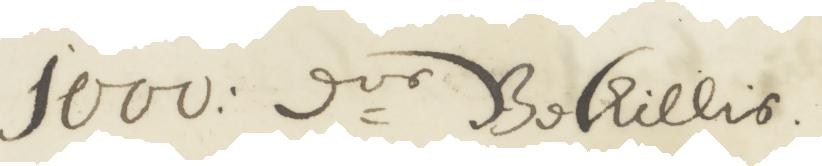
1000: D=os Bethillis.
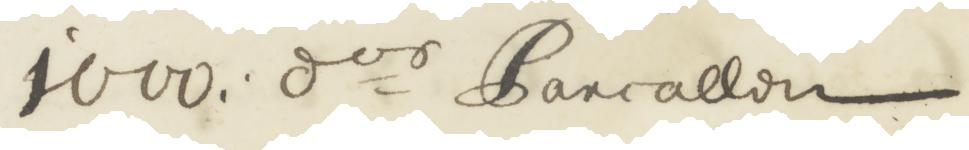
1000: D=os Parcallen
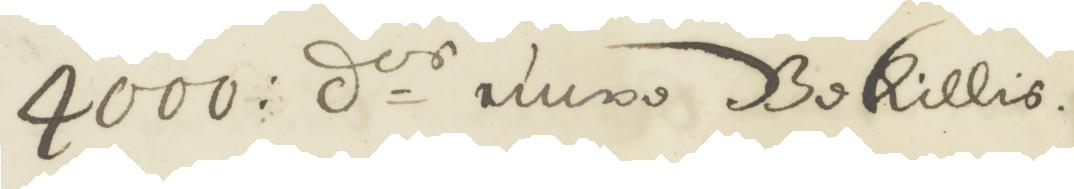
4000: D=os ruw Bethillis.
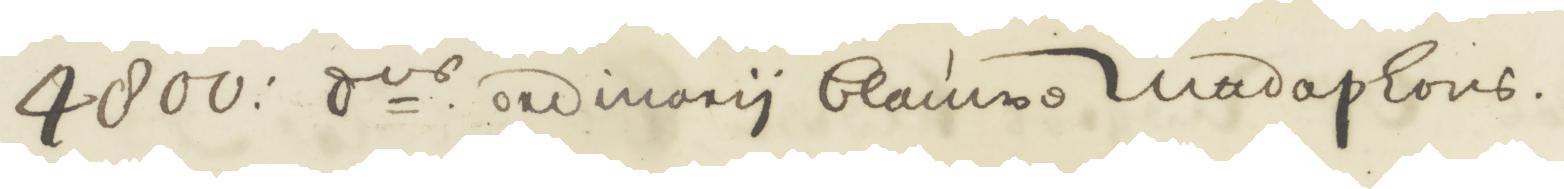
4800: D=os ordinarij blauwe madaphons.
